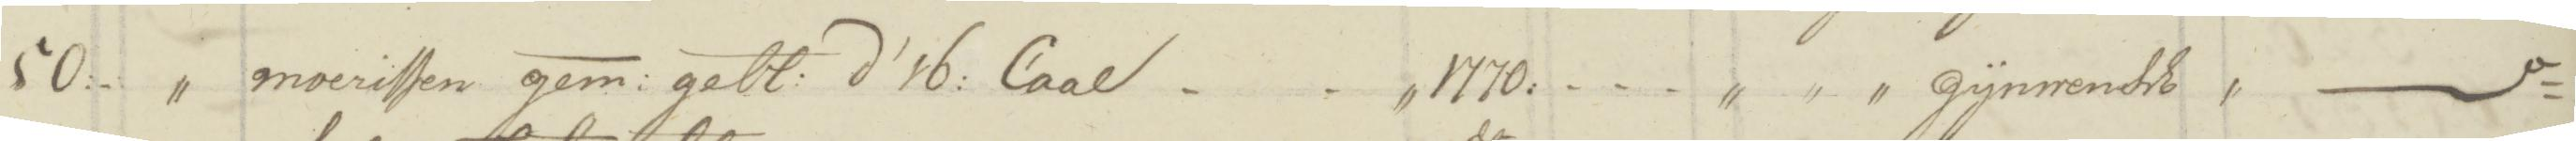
50:-: „ moerissen gem: gebl: d’16: Caal - - „ 1770: - - - „ „ „ gijnwensch „ _=o
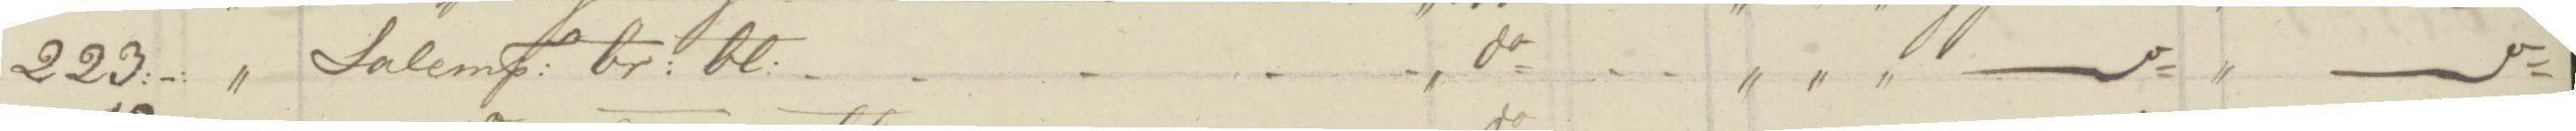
223:-: „ Salemp:s br: bl: - - - - „ d=o - - „ „ „ _=o „ _=o
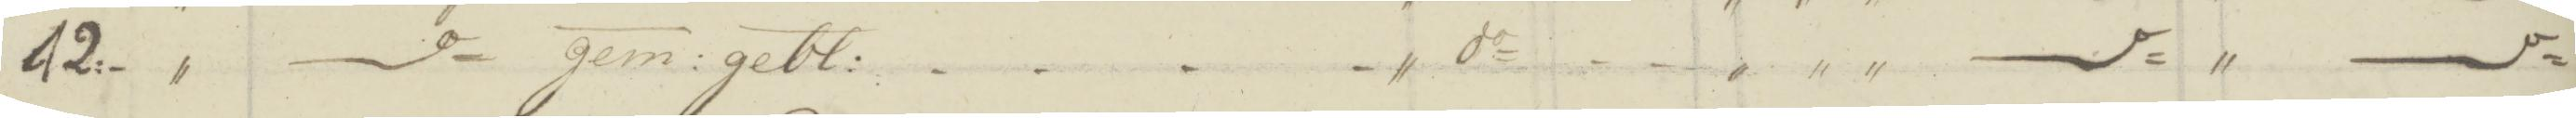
42:- „ _=o gem: gebl: - - - - „ d=o - - „ „ „ _=o „ _=o
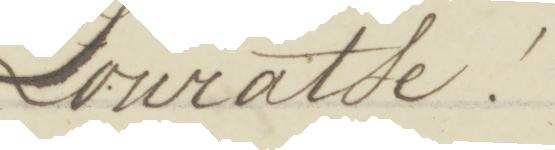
Zouratse!
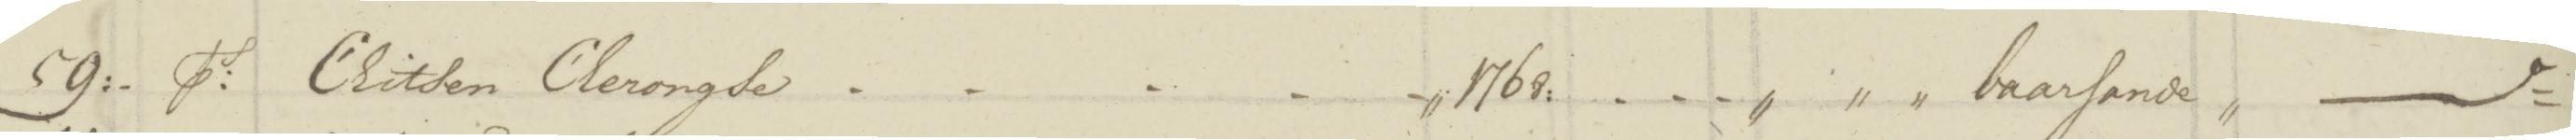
59: p:s Chitsen Cherongse - - - - „ 1768: - - - „ „ „ baarsande„ _=o
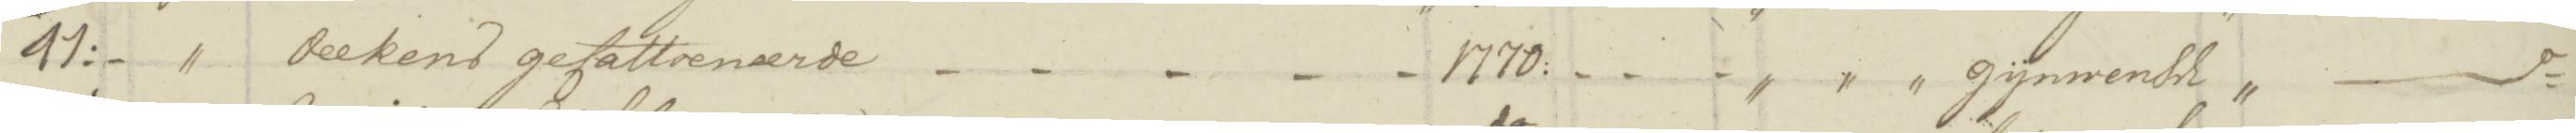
41:- „ deekens gecattoeneerde - - - - - 1770: - - - „ „ „ gijnwensch „ _=o
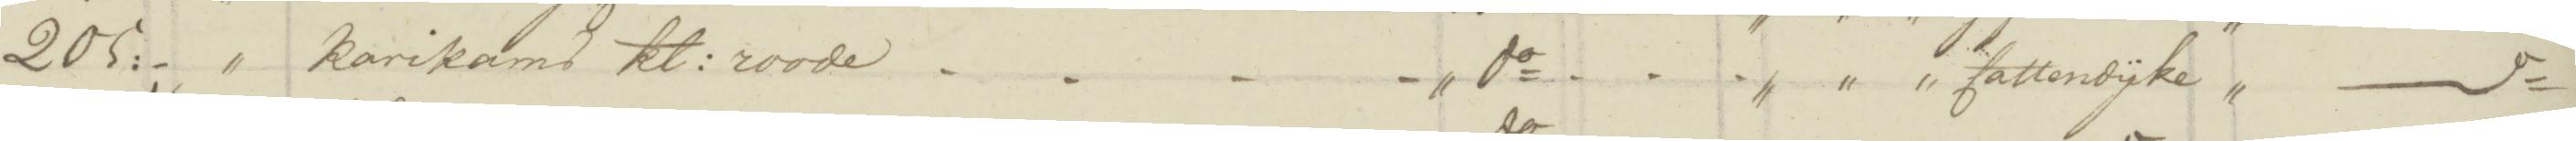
205:- „ karikams kl: roode - - - - „ d=o - - - „ „ „ cattendijke „ _=o
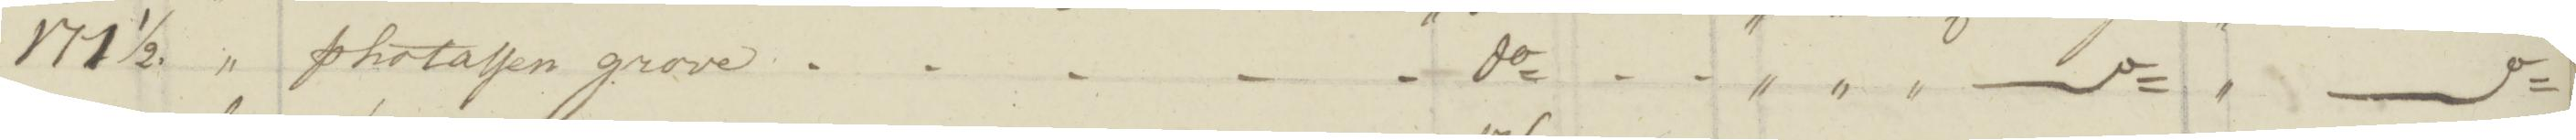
171½. „ photassen grove - - - - - d=o - - „ „ „ _=o „ _=o
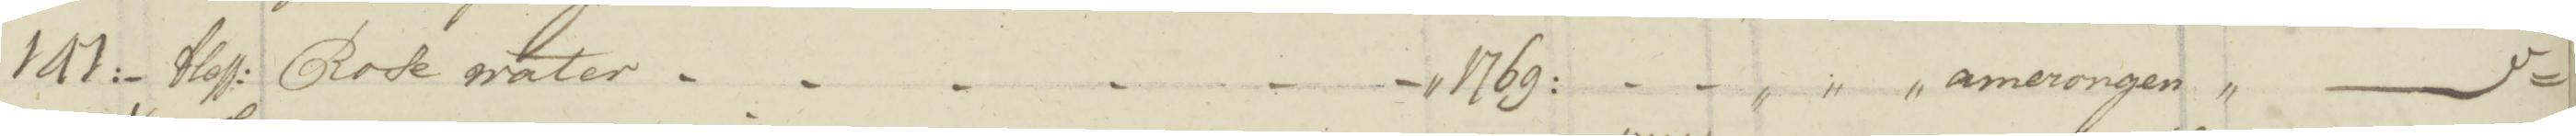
141:- fless: Rose water - - - - - - „ 1769: - - „ „ „ amerongen „ _=o
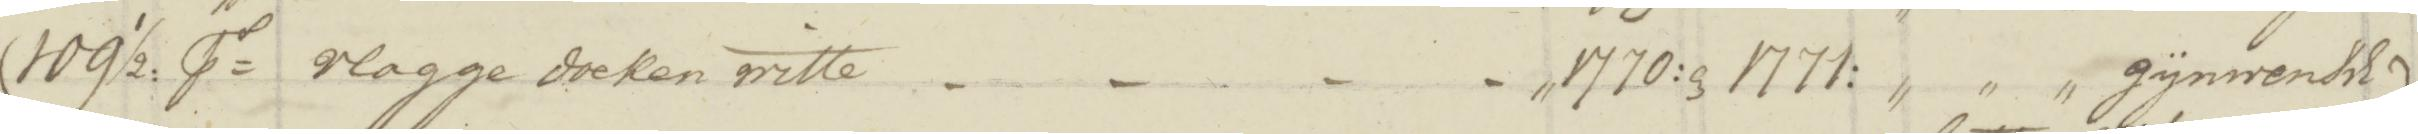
109½: p=s vlagge doeken witte - - - - „1770:en 1771: „ „ „ gijnwensch
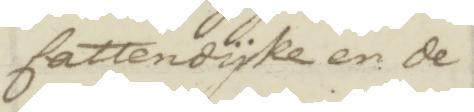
cattendijke en de
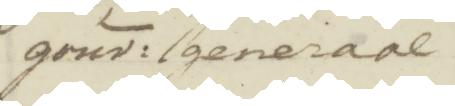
gouv: generaal
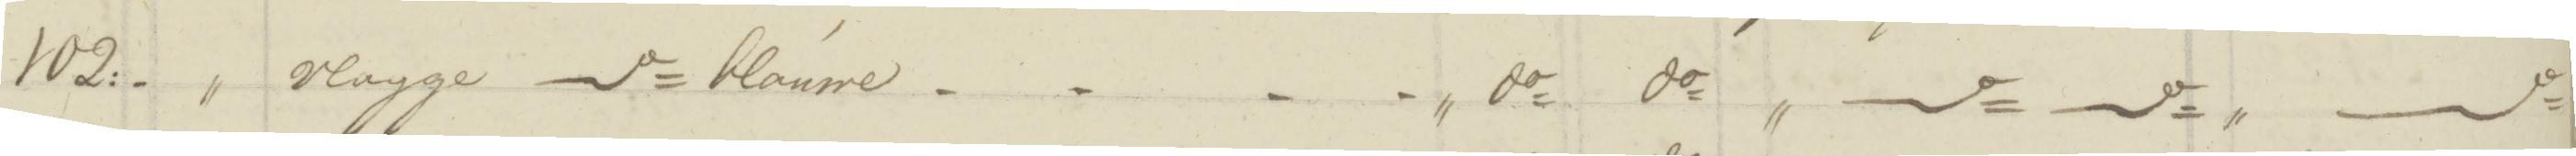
102:- „ vlagge _=o blauwe - - - - „ d=o d=o „ _=o _=o „ _=o
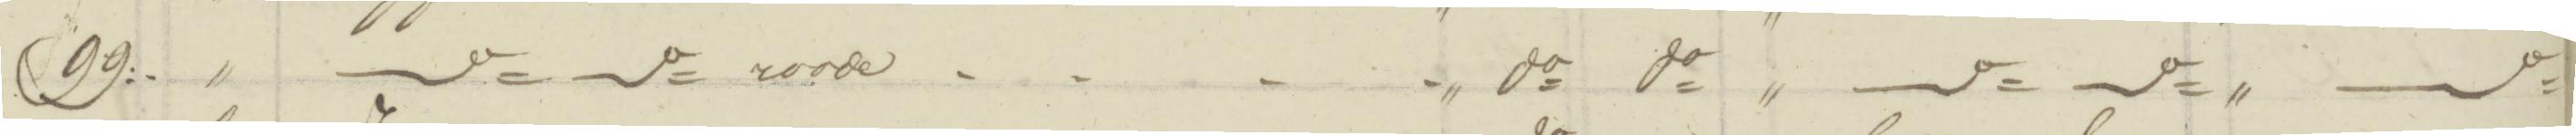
99:- _„o _„o roode - - - -„ d=o d=o „ _=o _=o „ _=o
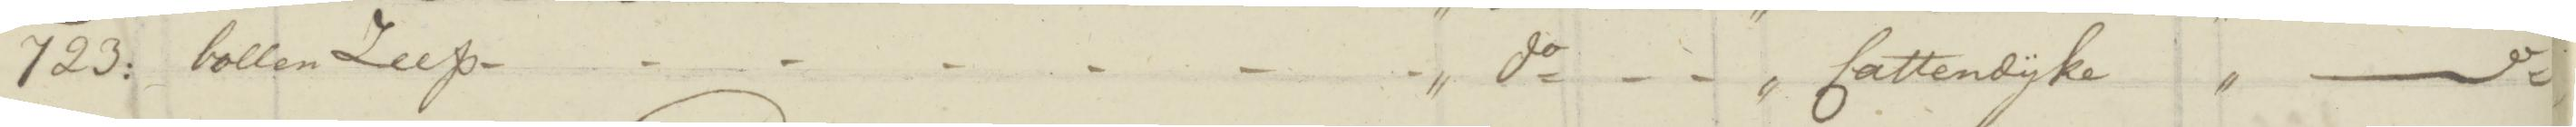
723: bollen Zeep - - - - - -„ d=o - - „ cattendijke „ _=o
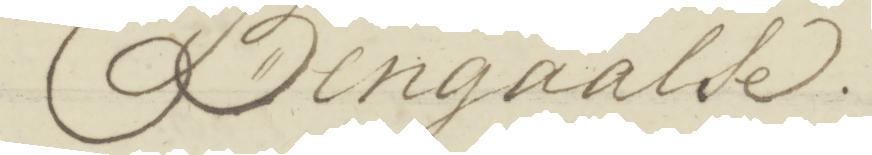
Bengaalse.
